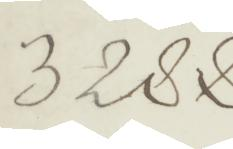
3288
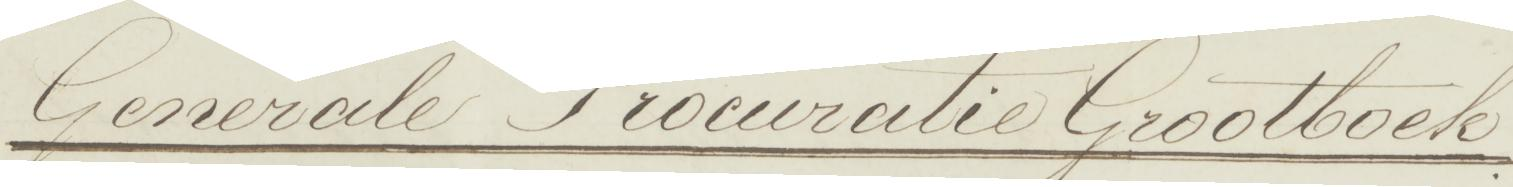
Generale Procuratie Grootboek
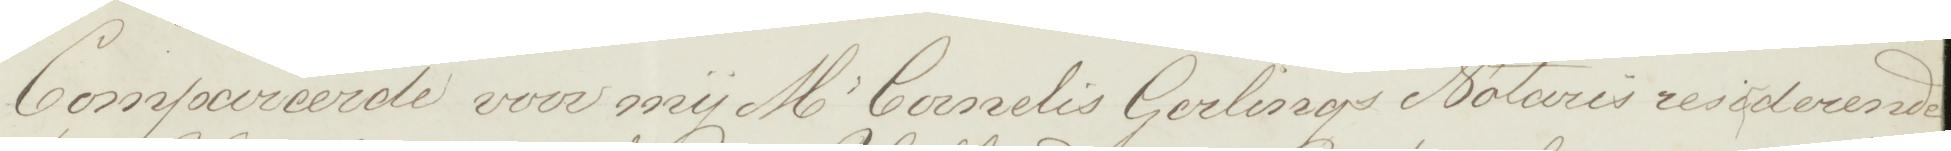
Compareerde voor mij Mr Cornelis Gerlings Notaris residerende
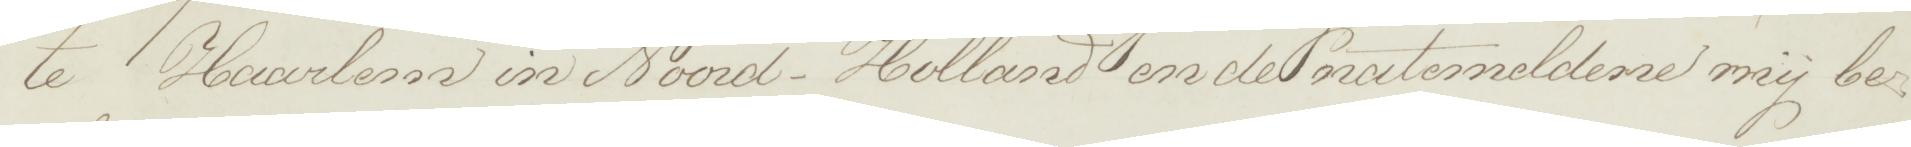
te Haarlem in Noord-Holland en de natemeldene mij be
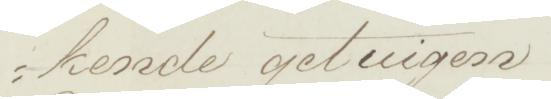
„kende getuigen
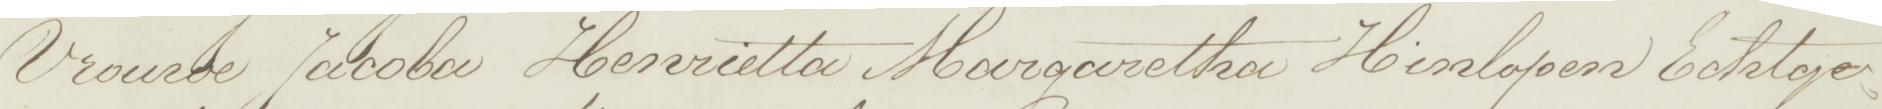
Vrouwe Jacoba Henrietta Margaretha Hinlopen Echtge
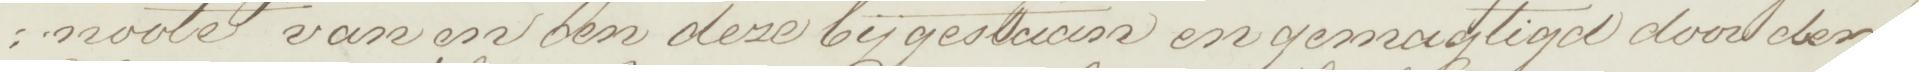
„noote van en ten deze bijgestaan en gemagtigd door den
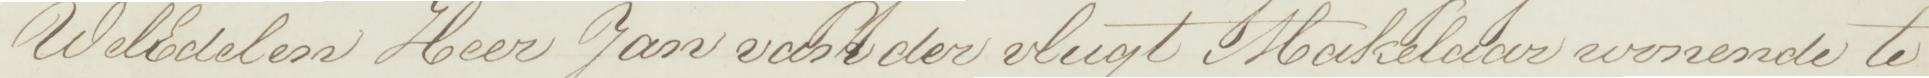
WelEdelen Heer Jan van der vlugt Makelaar wonende te
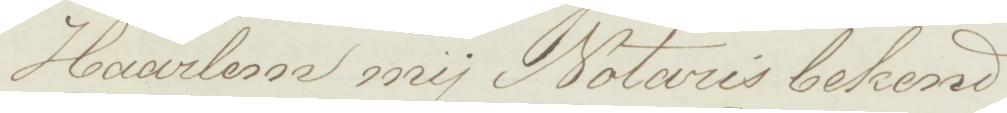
Haarlem mij Notaris bekend
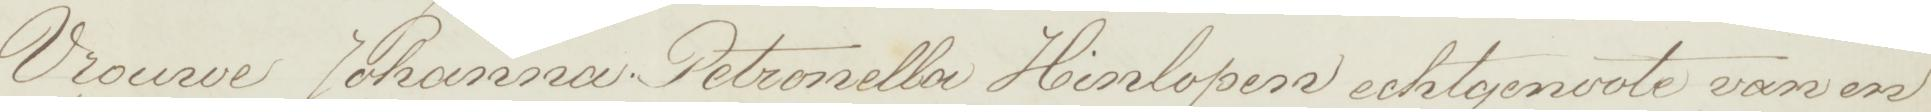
Vrouwe Johanna Petronella Hinlopen echtgenoote van en
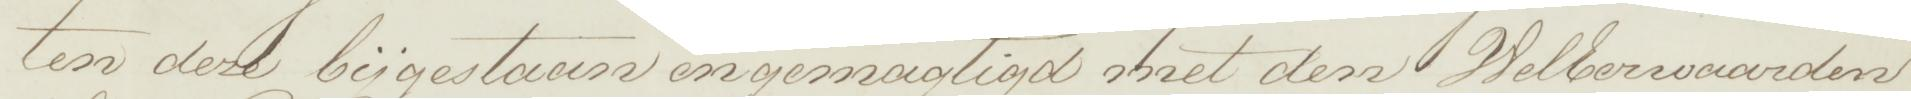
ten deze bijgestaan en gemagtigd met den WelEerwaarden
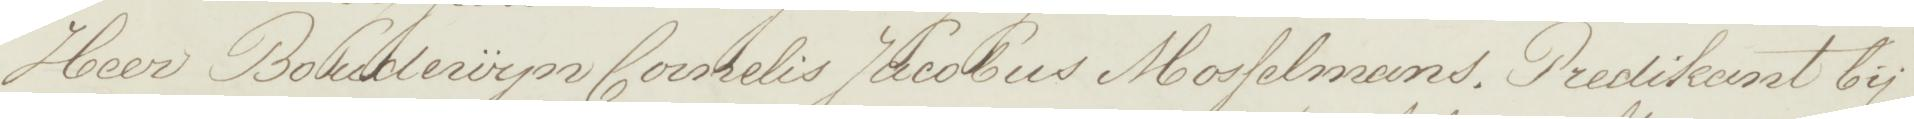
Heer Boudewijn Cornelis Jacobus Mosselmans, Predikant bij
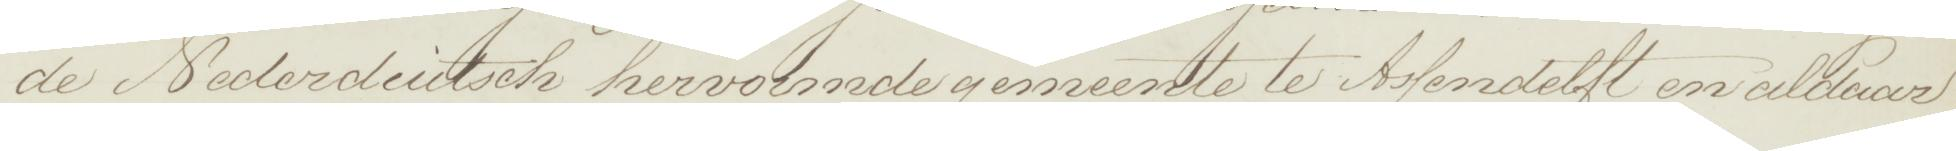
de Nederduitsch hervormde gemeente te Assendelft en aldaar
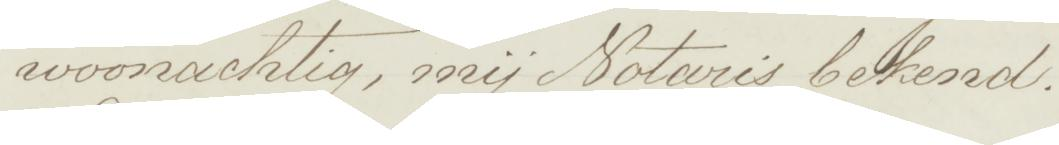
woonachtig, mij Notaris bekend.
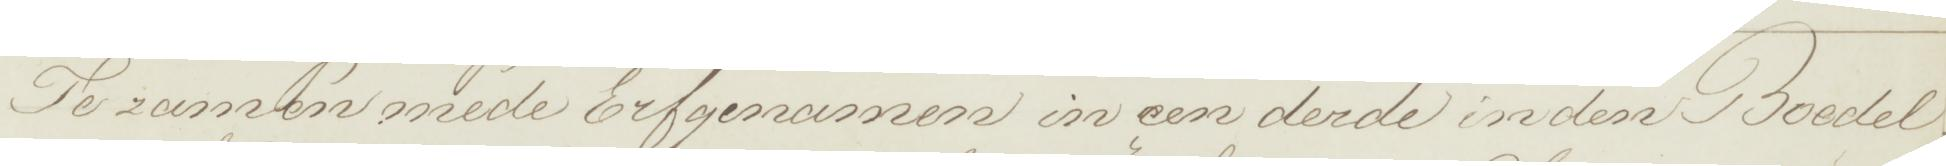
Tezamen mede Erfgenamen in een derde in den Boedel
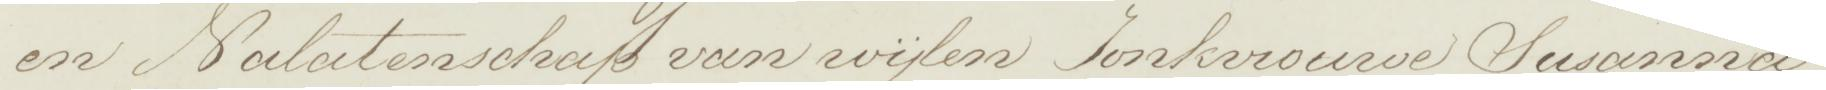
en Nalatenschap van wijlen Ionkvrouwe Susanna
